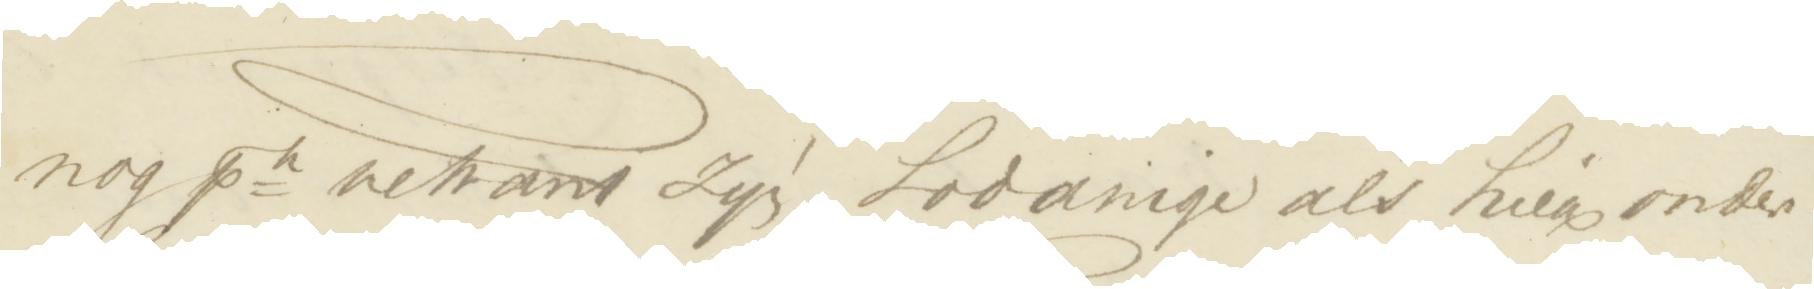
nog p=r restant zijn sodanige als hier onder
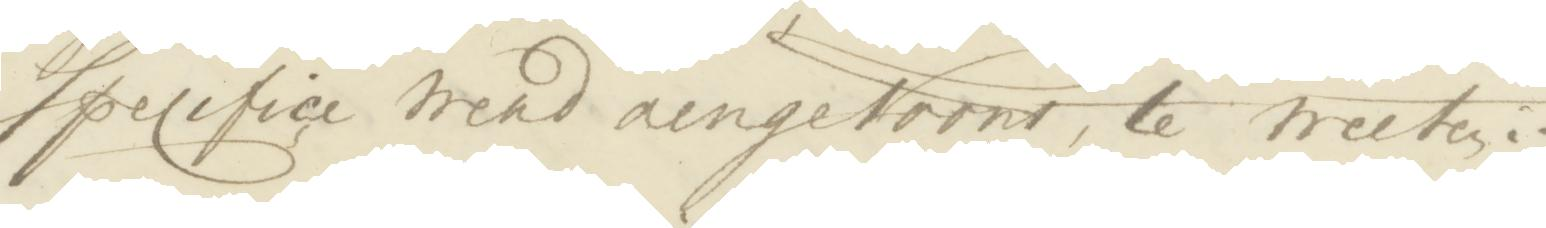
Specifice werd aengetoont, te weeten:
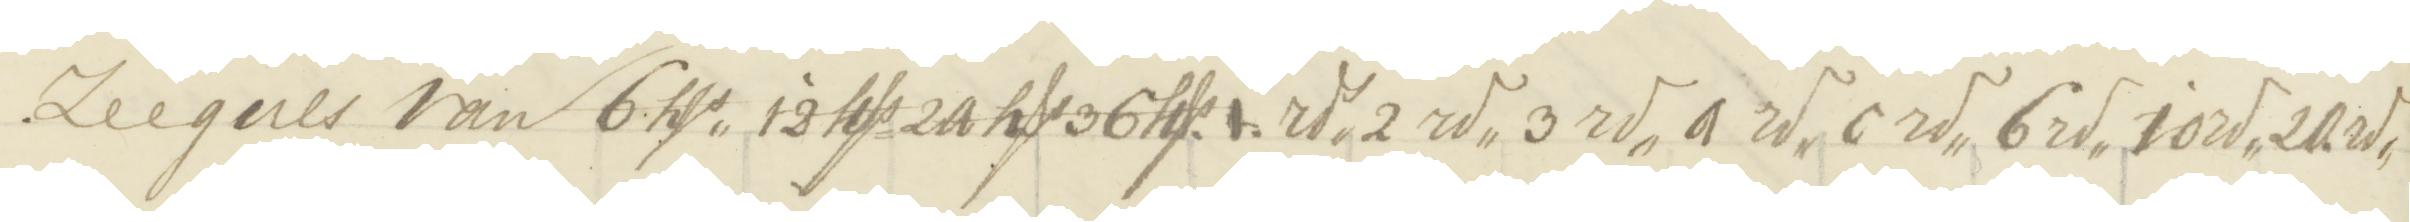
Zeeguls van 6 stver„s 12stver„s 24stvers 36stver.s 1. rd„ 2 rd„ 3 rd„ 4 rd„ 5rd„ 6 rd„ 10 rd„ 20. rd„
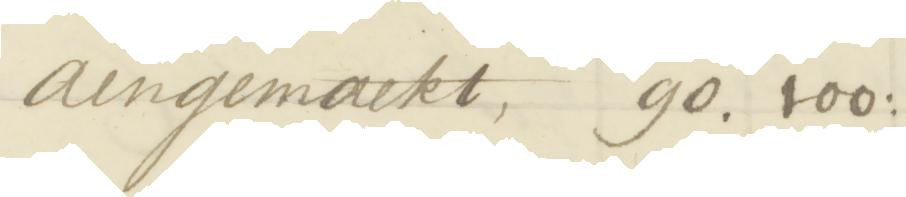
aengemaekt, 90.100: = = 7. = = = = = = =
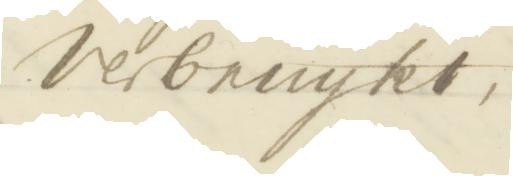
verbruijkt, 126. 52. 28 = 5. = 1. = 1: 1: = =
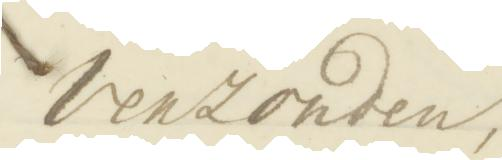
verzonden, 24. 12. = = = = = = = = = =
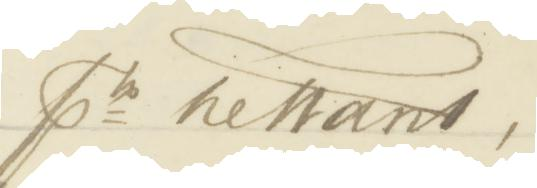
p=r restant,
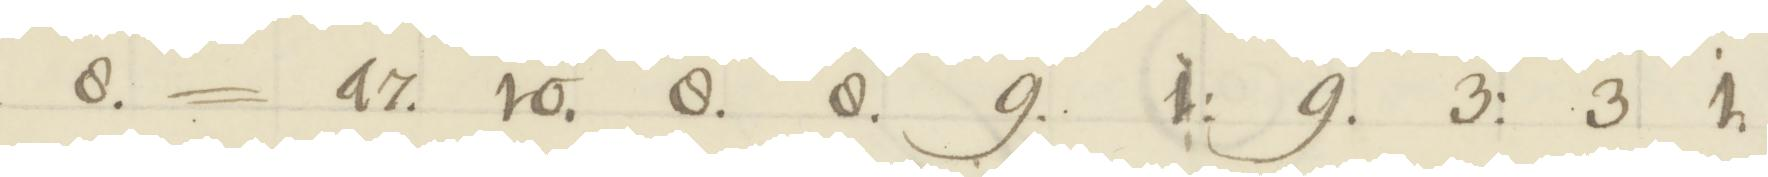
8. = 47. 10. 8. 8. 9. 1: 9. 3: 3 1.
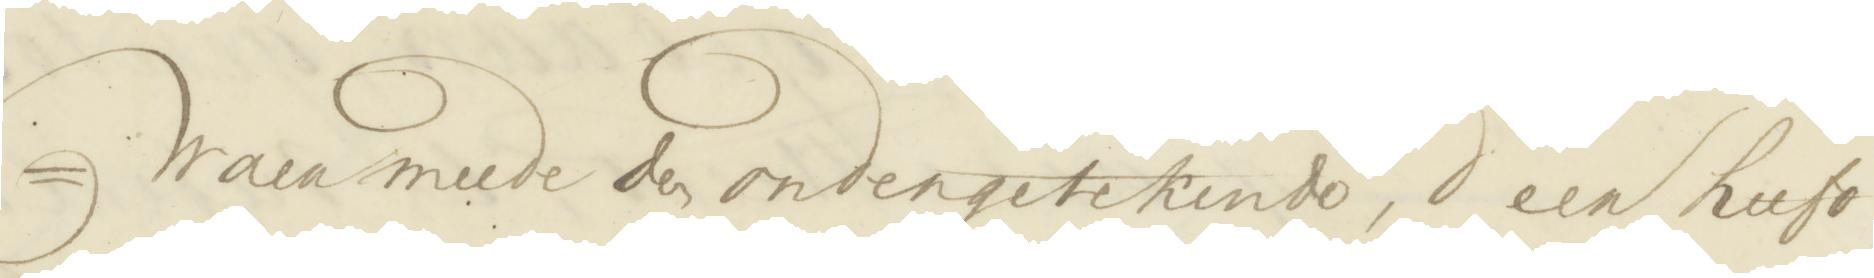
Waermeede den ondergetekende, d’een heeft
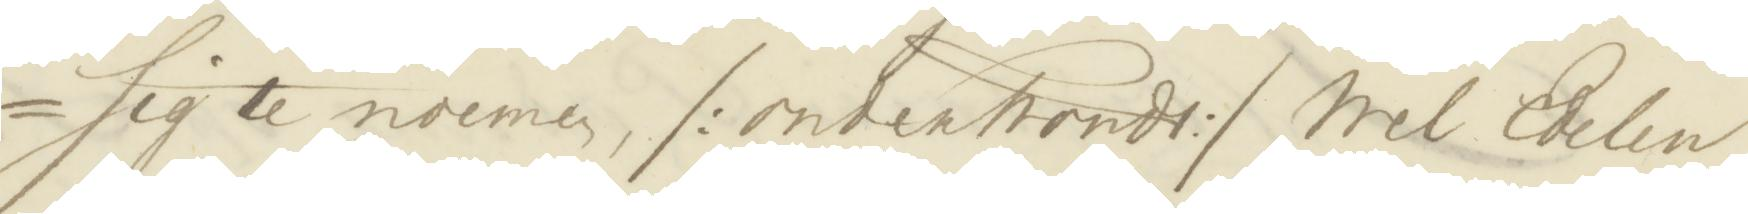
sig te noemen, /:onderstondt:/ wel Edelen
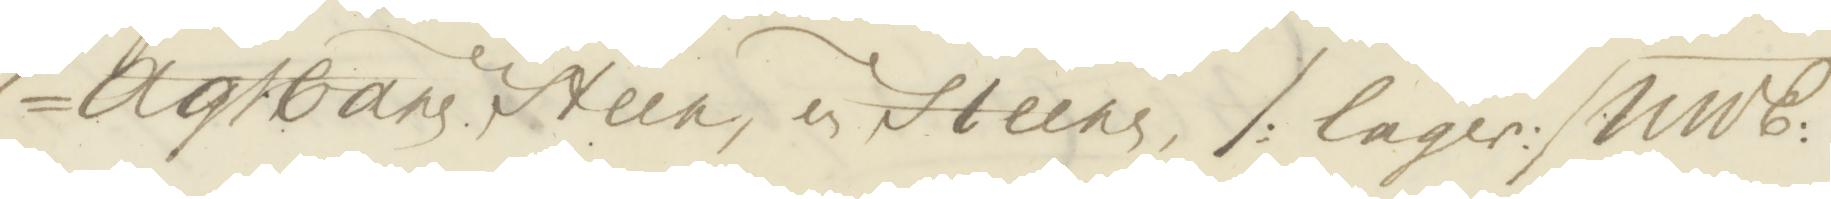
Agtbaren Heer, en Heeren, /: lager:/ uwE:
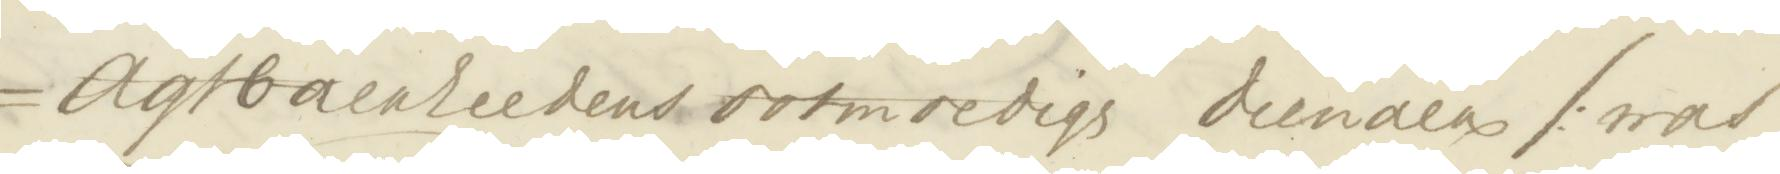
Agtbaerheeders ootmoedige dienaer /: was
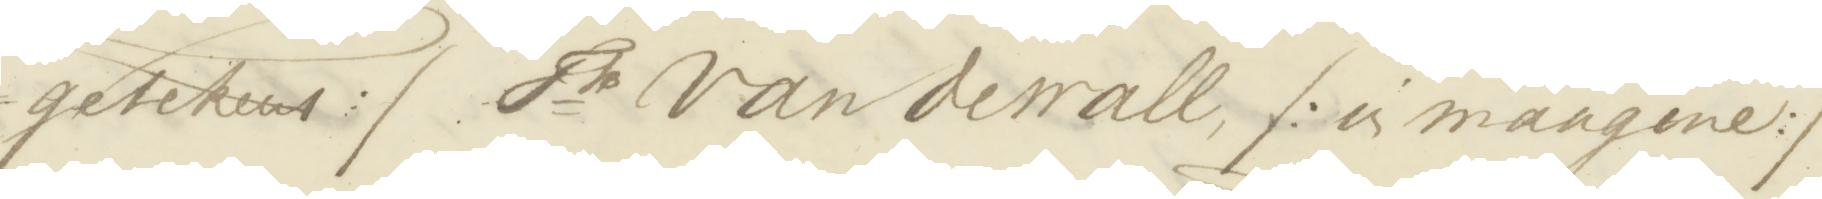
getekent :/ J=s van de wall, /:in margene:/
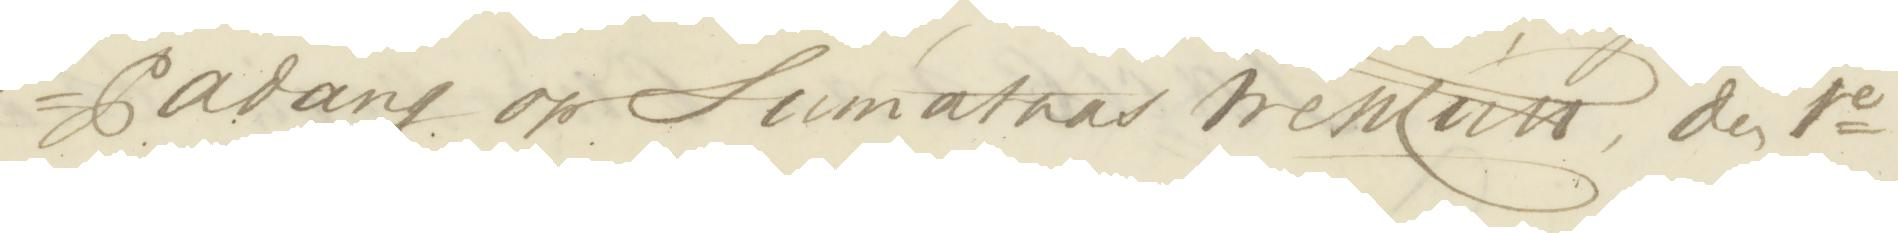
Padang op Sumatras westcust, den 1=e
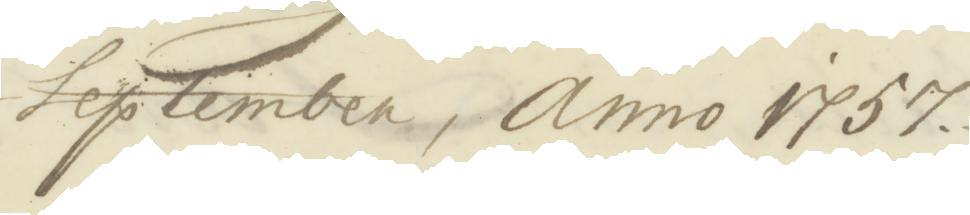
september, Anno 1757.
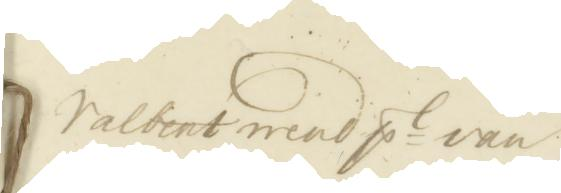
Valbert werd p=l van
